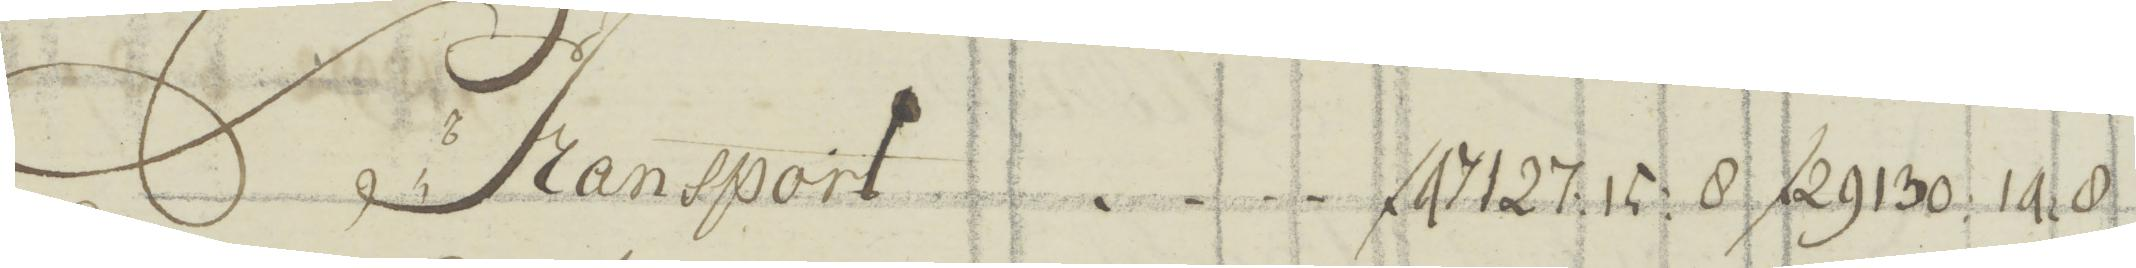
P„r Transport ƒ47127:15: 8. ƒ29130: 14: 8
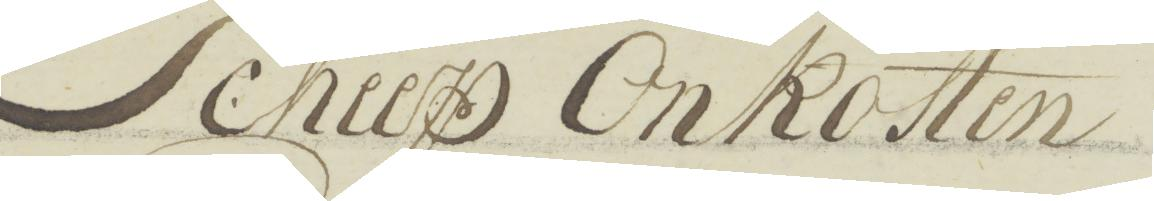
Scheep Onkosten
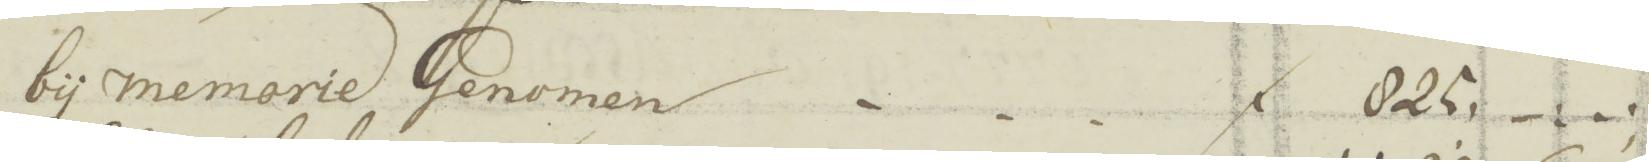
bij memorie Genomen - - - ƒ 825: —:—:
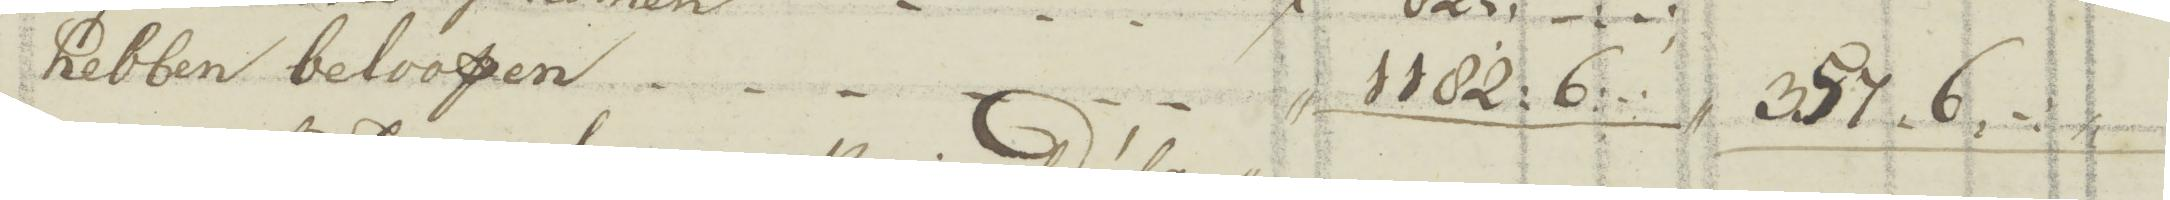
hebben beloopen - - - - - - „ 1182: 6:-: „ 357:6:-:„
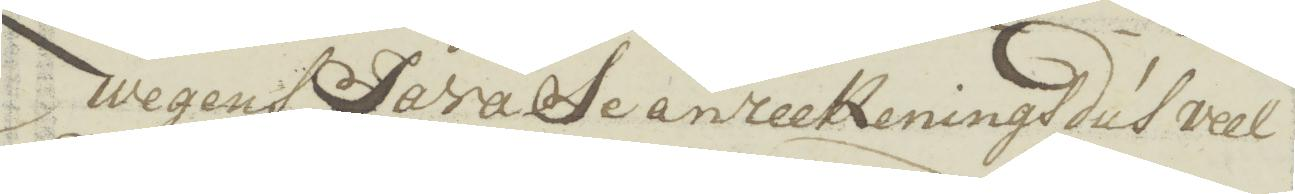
wegens Iavase anreekenings dus veel
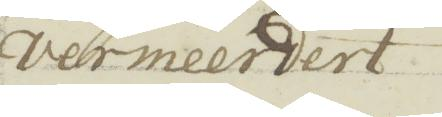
vermeerdert
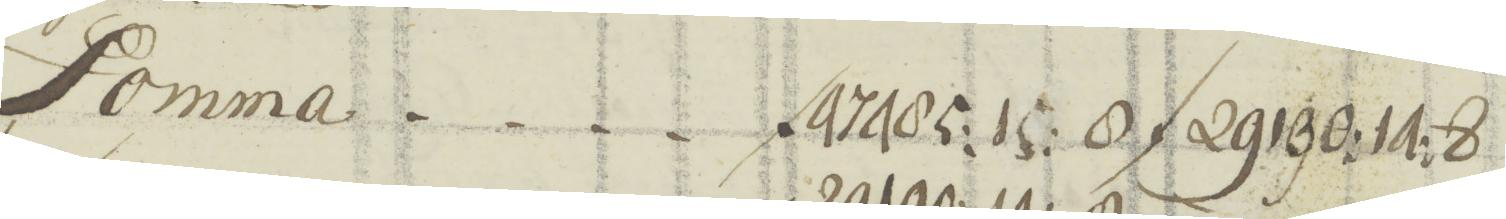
Somma - - - - ƒ47485:15: 8 ƒ29130:14:8:
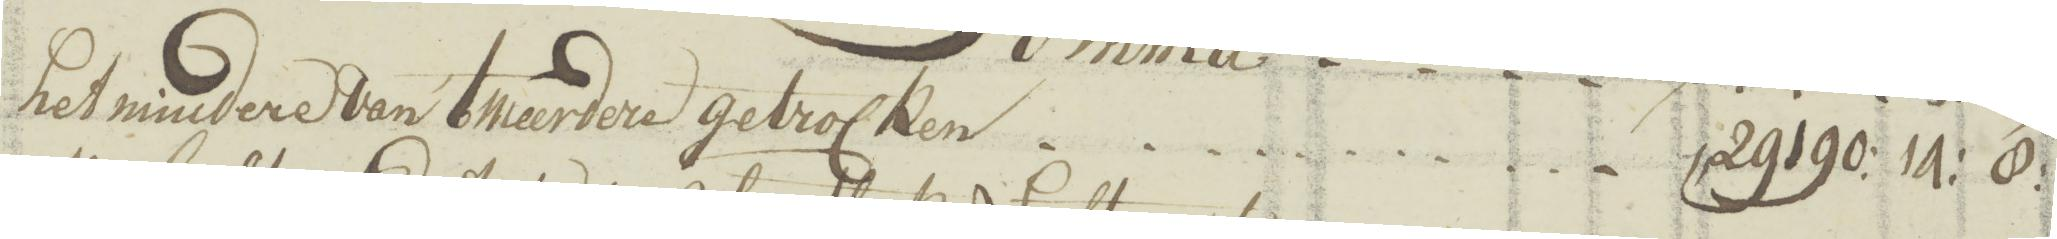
het mindere van 'tmeerdere getrocken . . - . . . . - . . -„ 29190: 14: 8:
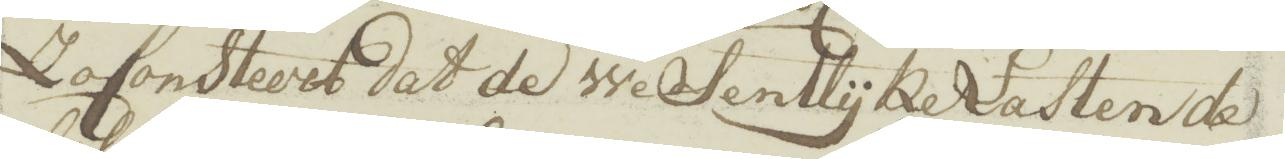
Zo consteert dat de wesentlijke Lasten de
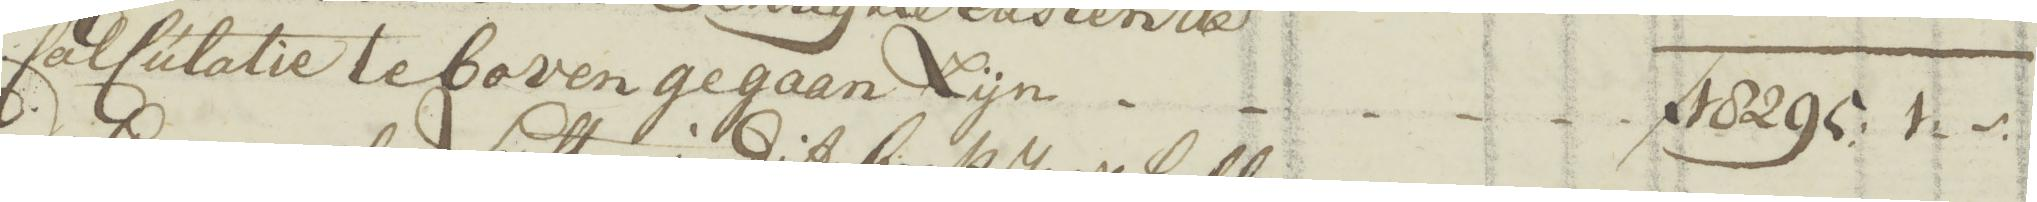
calculatie te boven gegaan zijn - - - - - . ƒ 18295: 1: -.
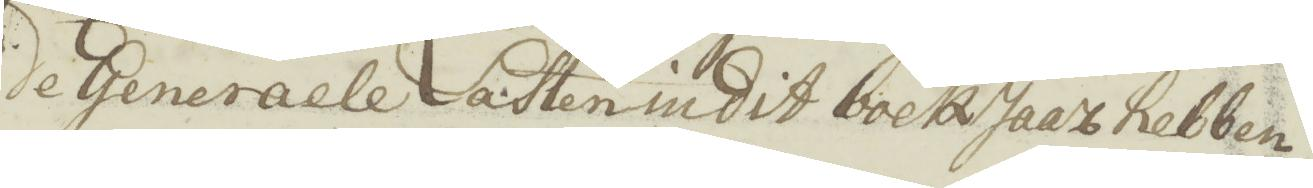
de Generaele Lasten in dit boekJaar hebben
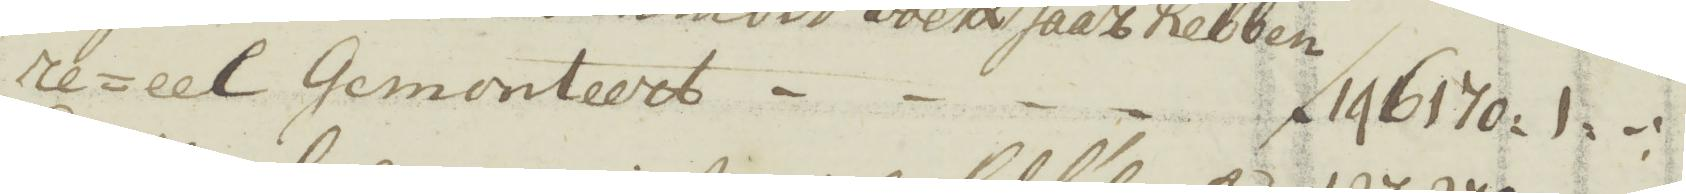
re=eel Gemonteert - - - - ƒ146170:1:—.
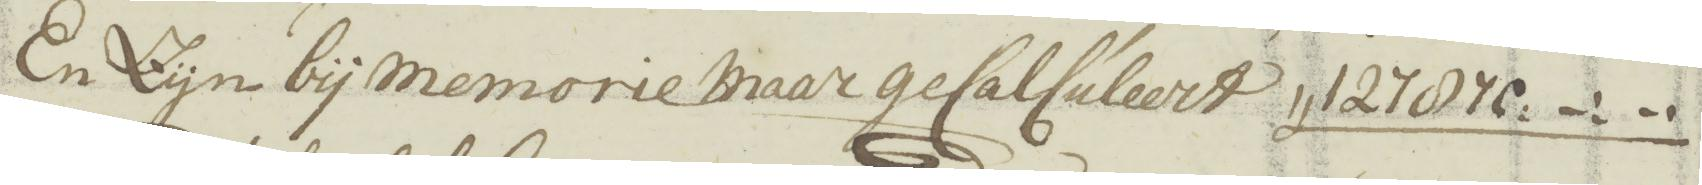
En zijn bij memorie maar gecalculeert „127875: —: —„
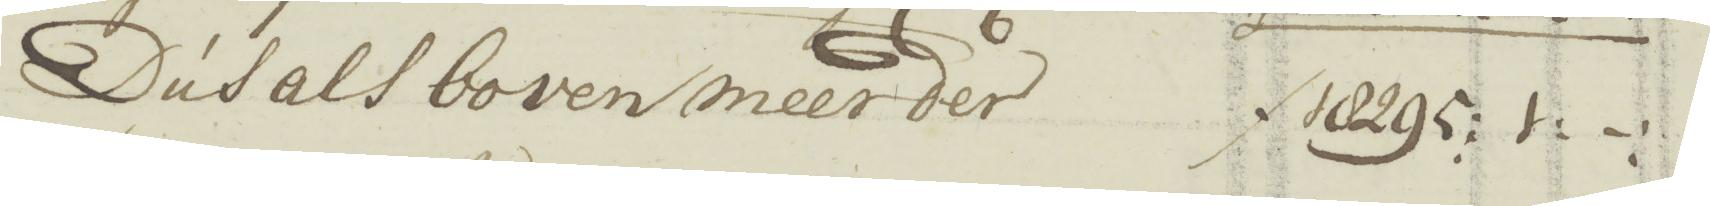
Dus als boven meerder ƒ18295: 1: -:
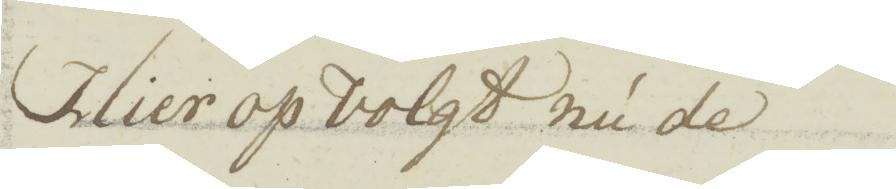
Hier op volgt nu de
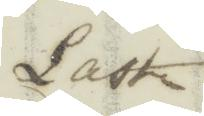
Laste
